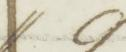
„ 9
